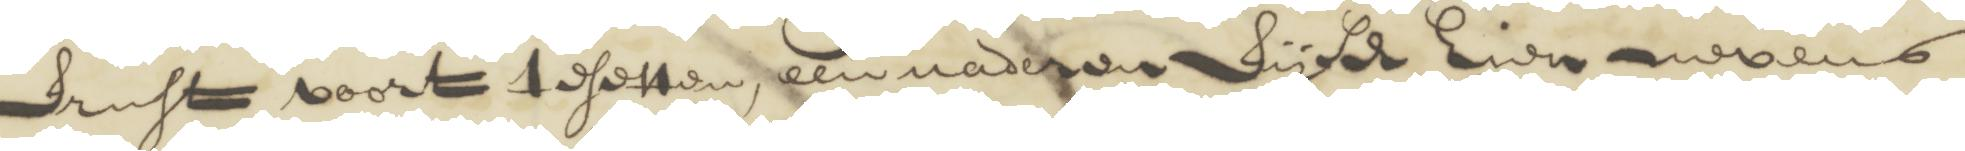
Ernst voort tesetten, een naderen Eijsch hier nevens
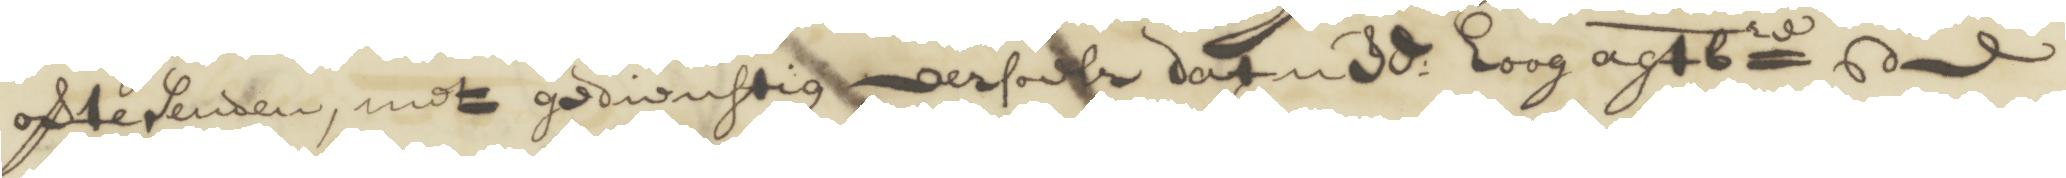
over te Senden, met gedienstig versoek dat u Ed: hoog agtb=re de
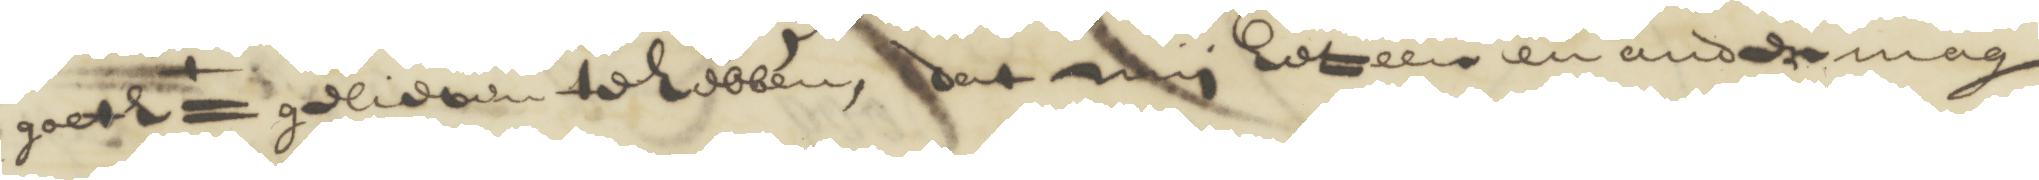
goeth=t gelieven te hebben, dat mij het een en ander mag
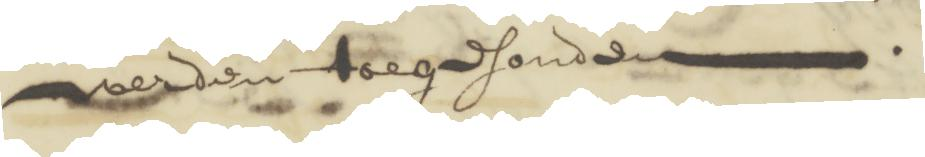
werden toegesonden.
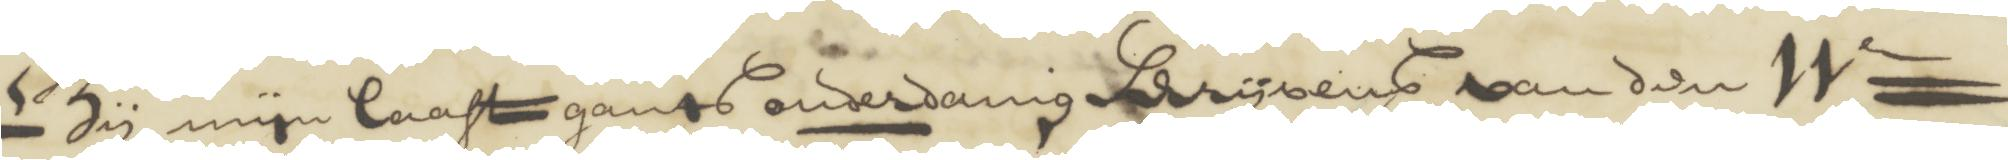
Bij mijn laast gants onderdanig Schrijvens van den 11=en
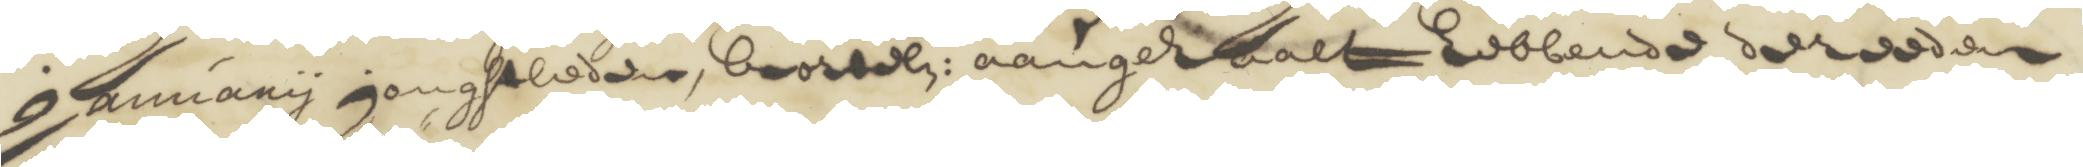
Januarij jongstleden, boortelijk aangehaalt hebbende de reeden
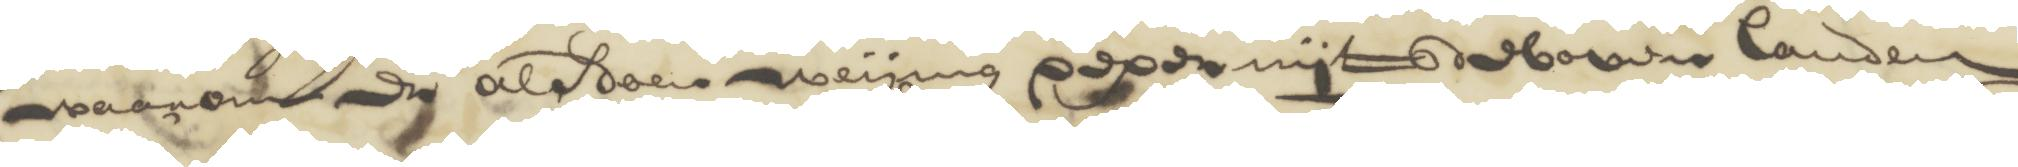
waarom en als doen weijnig peper uijt de boven landen
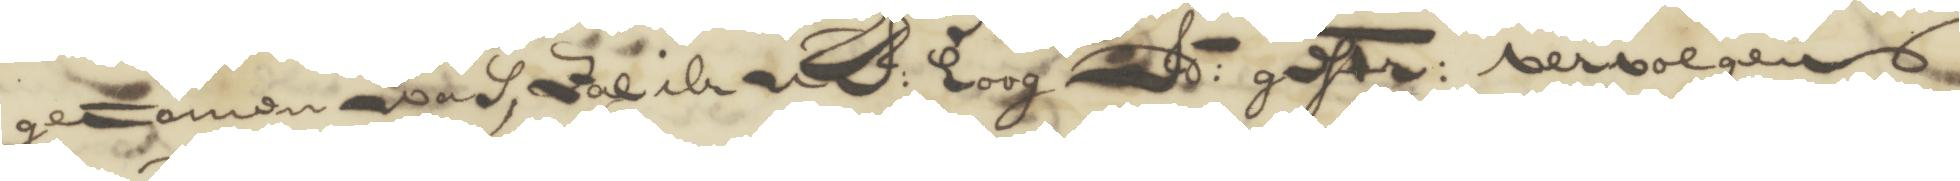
gecomen was, Zal ik uE: hoog Ed: gestr: vervolgens
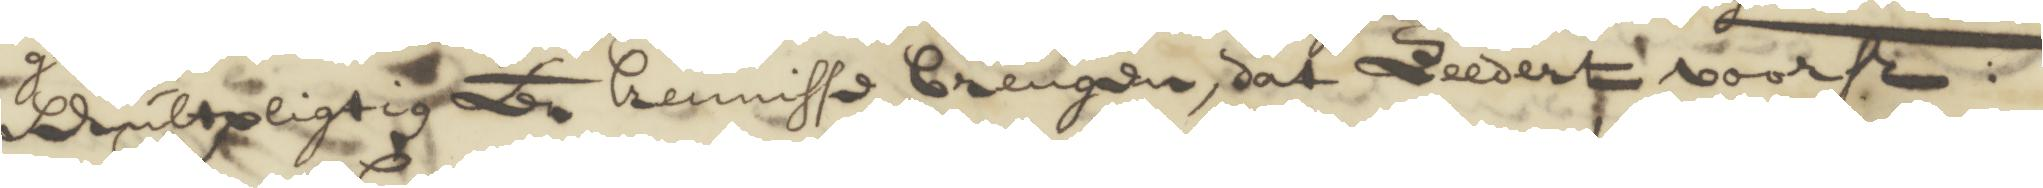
Schultpligtig ter kennisse brengen, dat Zeedert voorsz:
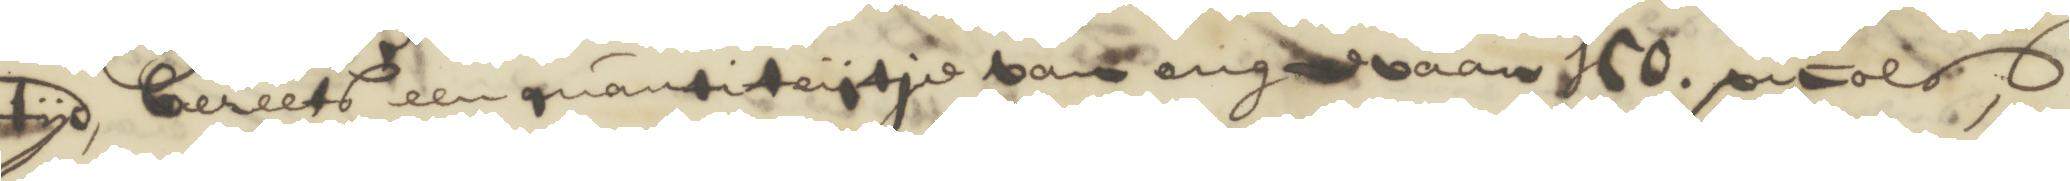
tijd, bereets een quantiteijtje van ongevaar 150. picols,
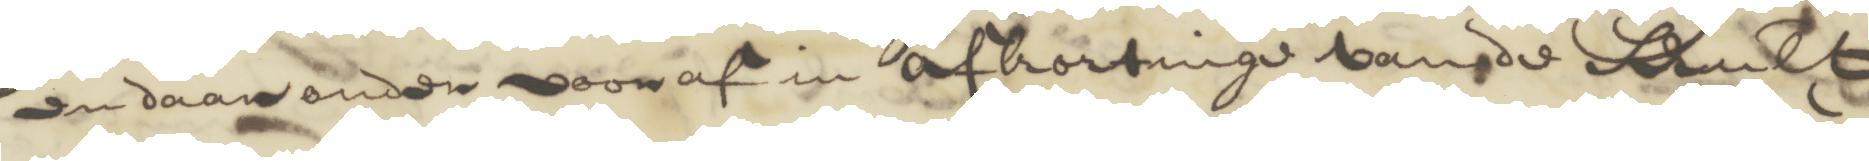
en daar onder voor af in afkortinge vande Schult
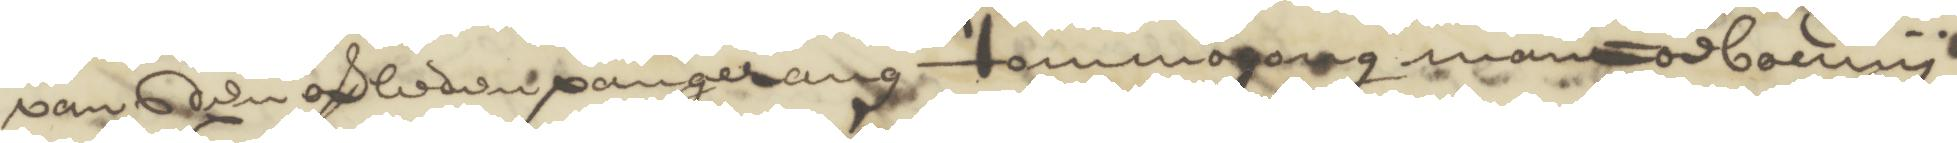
van den overleden pangerang tommogong mancoeboemij
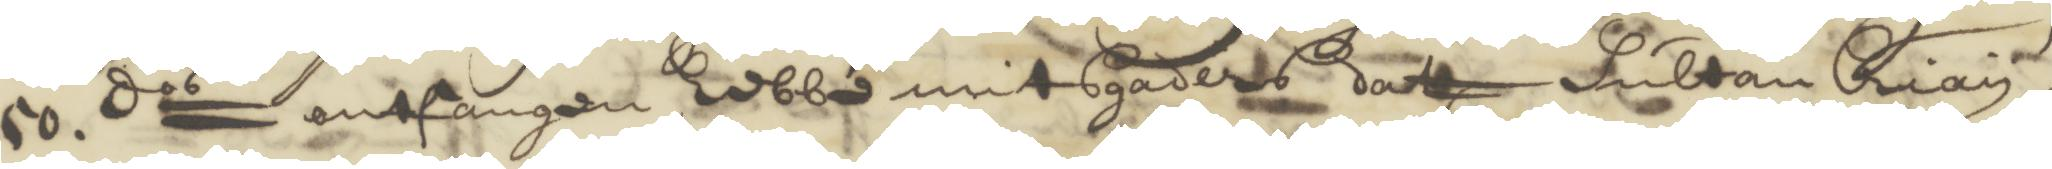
50. d=os ontfangen hebbe mitsgaders dat Sultan kiaij
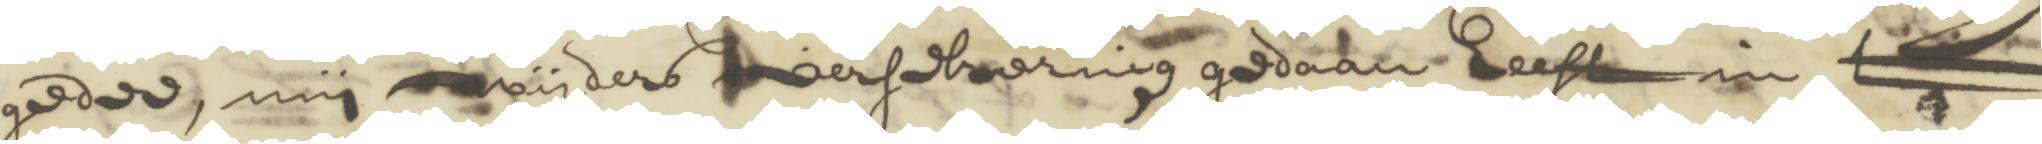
gedee, mij wijders versekering gedaan heeft in 't
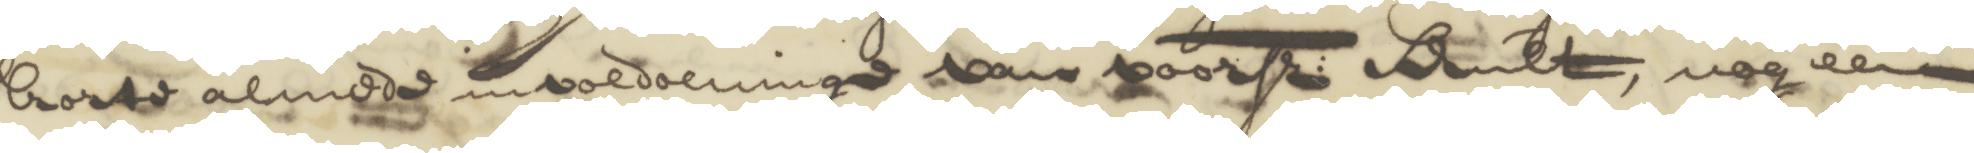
korte almede in voldoeninge van voorsz: Schult, nog een
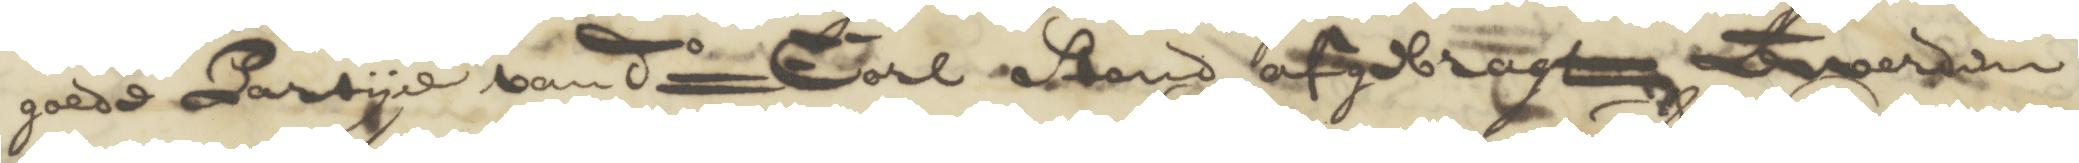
goede Partije van d=o Corl Stond afgebragt te werden
